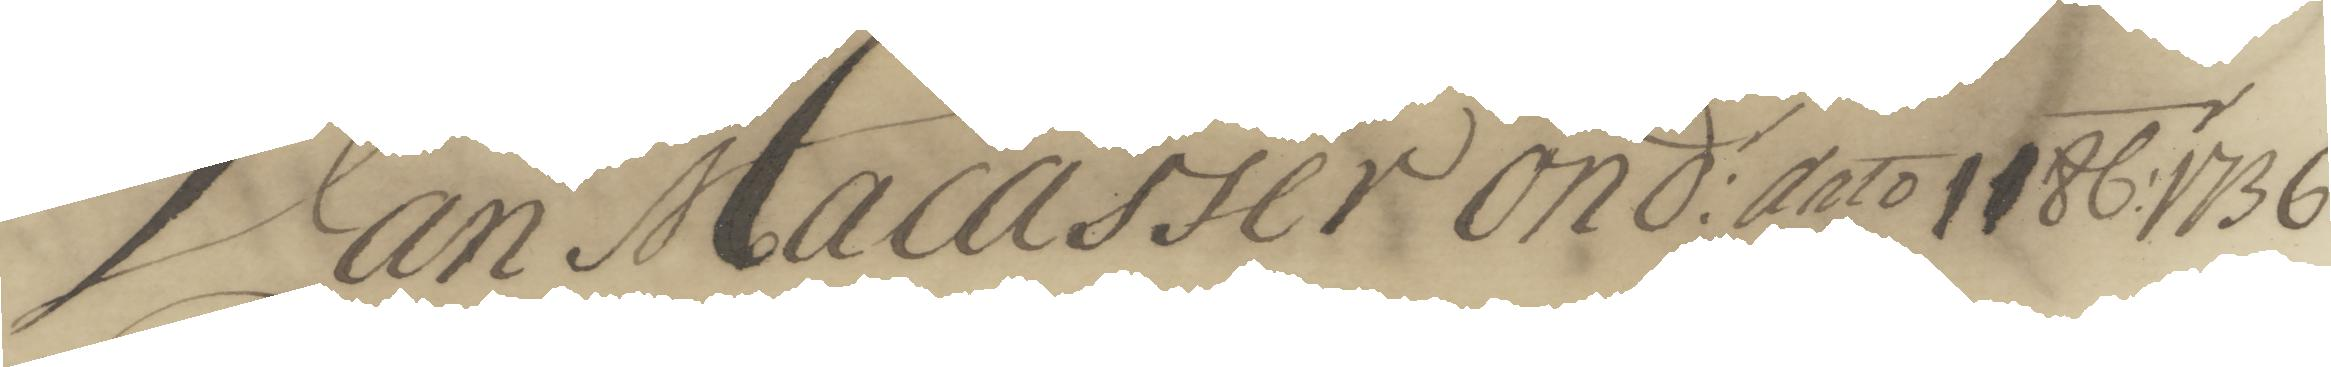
Van Macasser ond:r dato 11 8b:r 1736
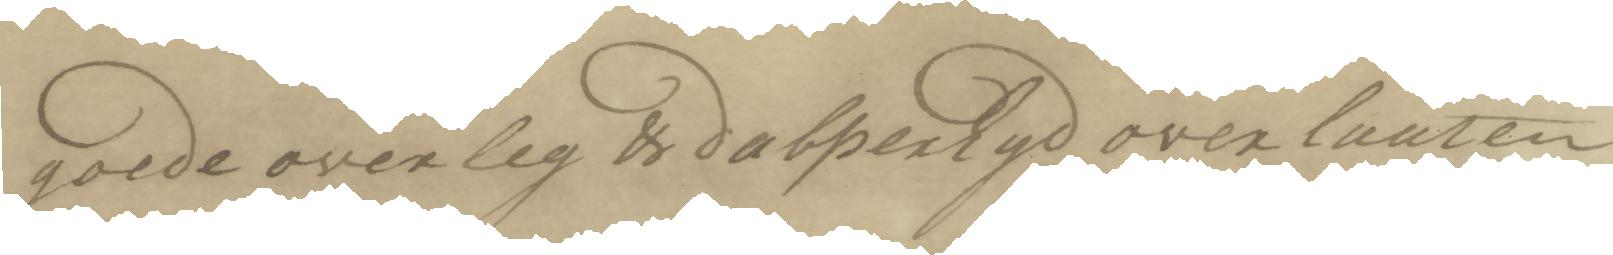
goede overleg & dabperhijd over laaten
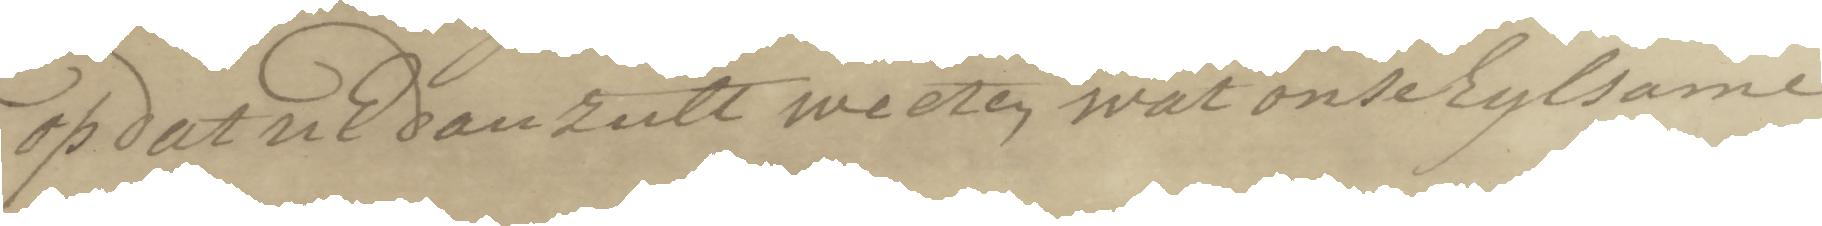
op dat uE dan zult weeten wat onse hylsame
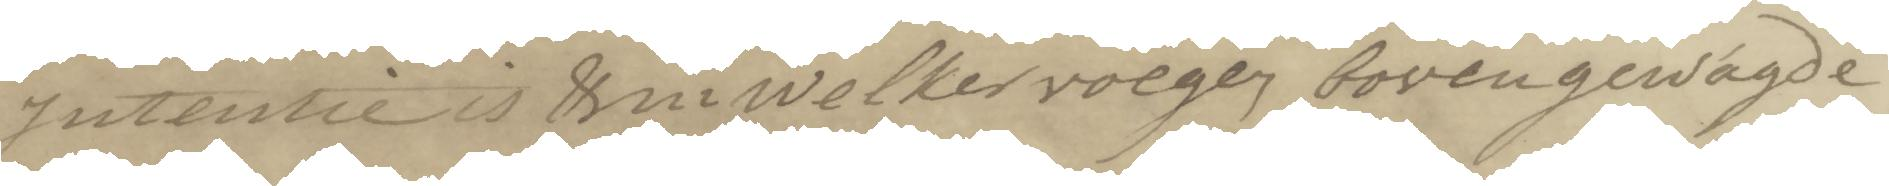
jntentie is & in welker voegen boven gewagde
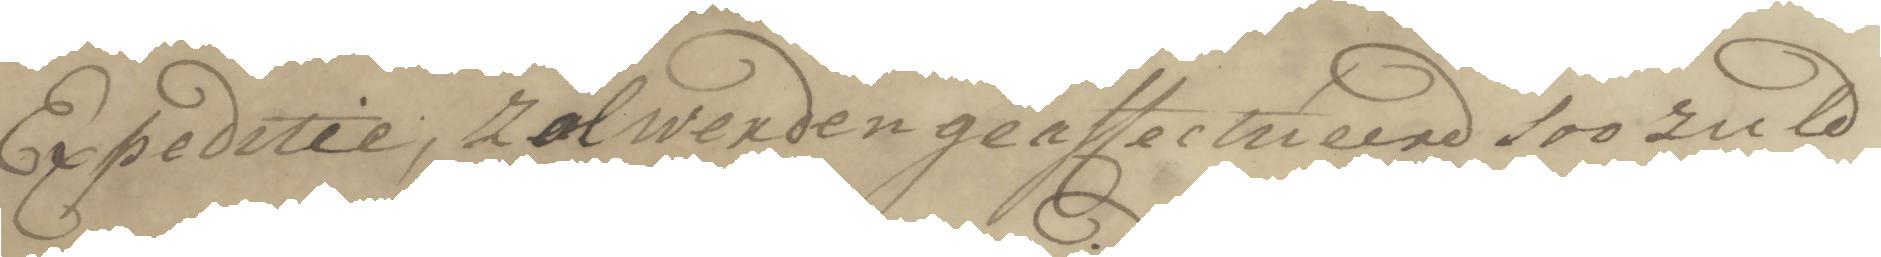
Expeditie, zal werden geaffectueerd soo zuld
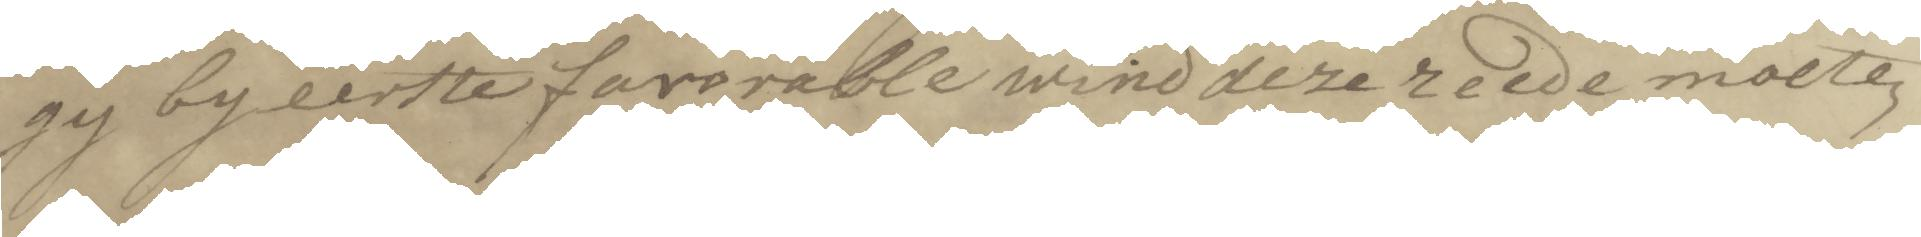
gy by eerste favorable wind deze reede moeten
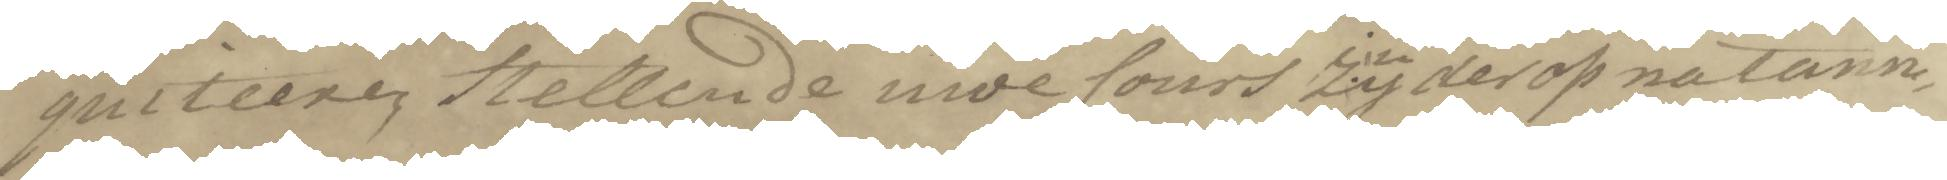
quiteeren stellende uwe Cours zuyder op na tann„
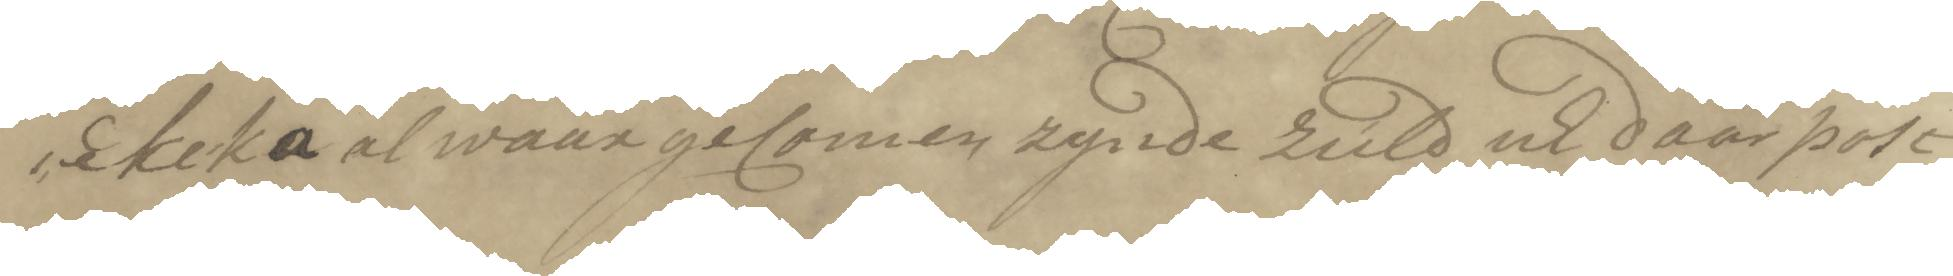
„ekeka al waar gecomen zynde zuld uE daar post
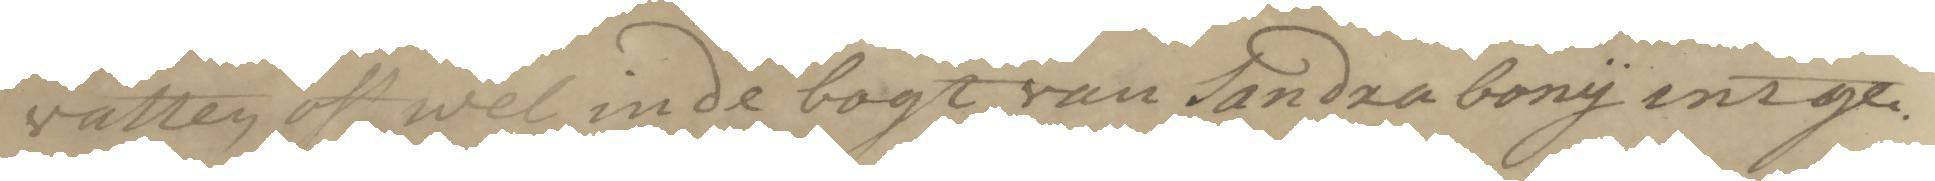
vatten off wel in de bogt van sandra bonij in't ge„
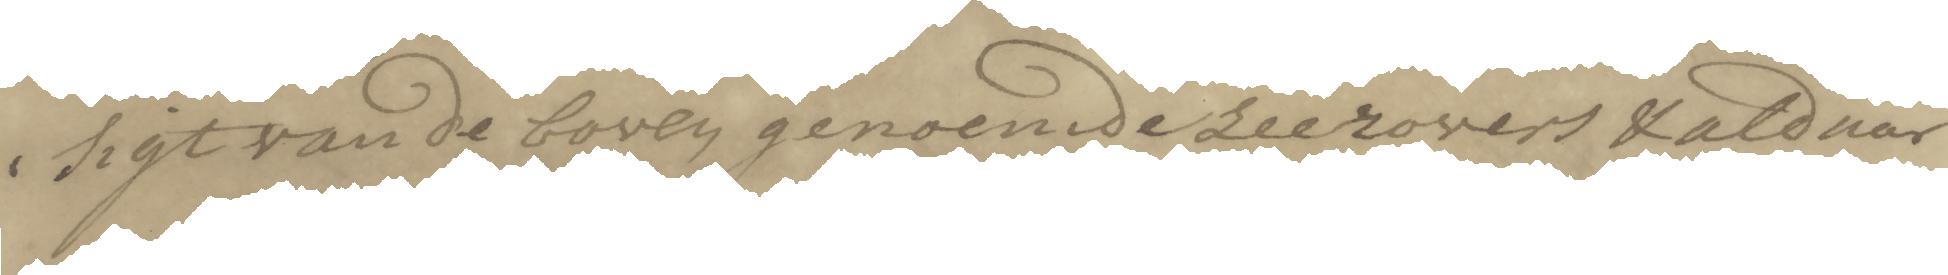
„sigt van de boven genoemde zeerovers & aldaar
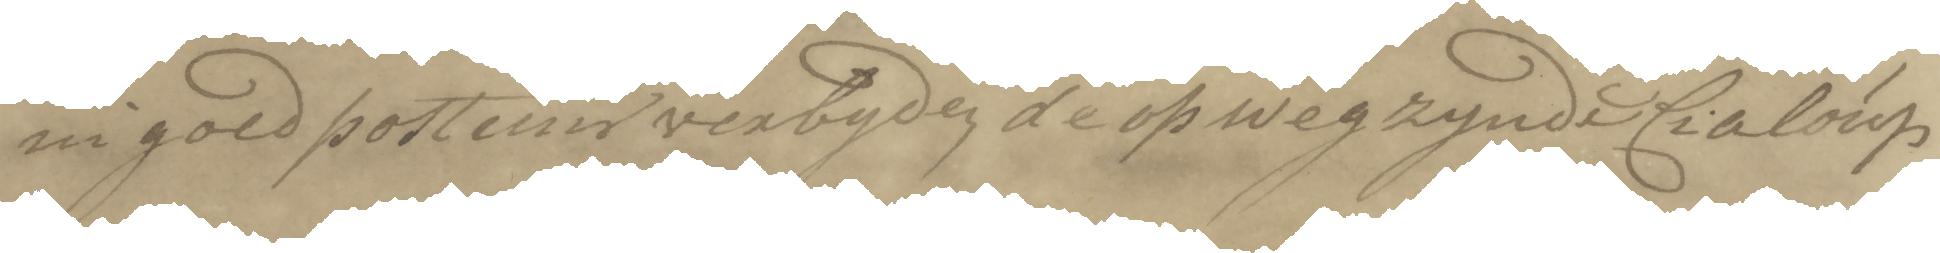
in goed postuur verbyden de op weg zynde Cialoup
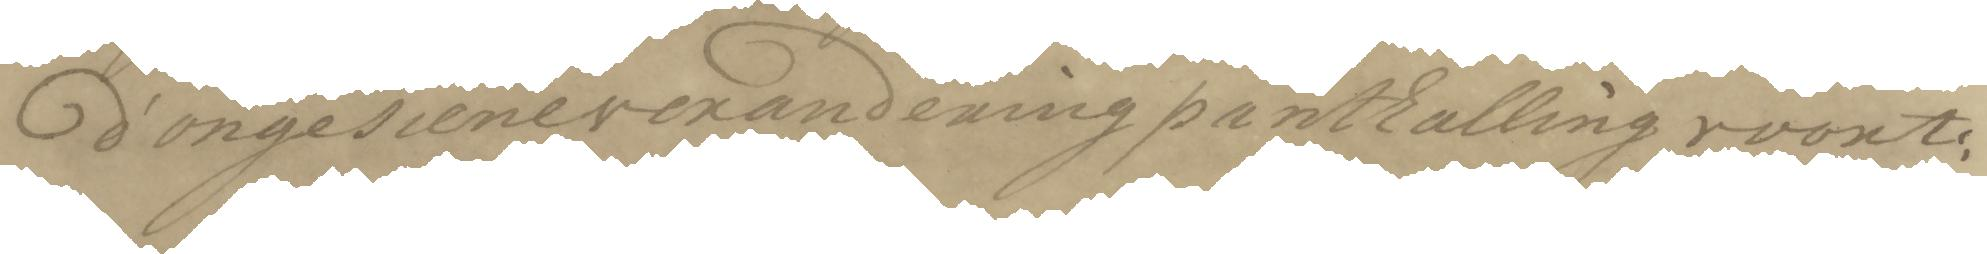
d’ongesiene verandering panthalling voort„
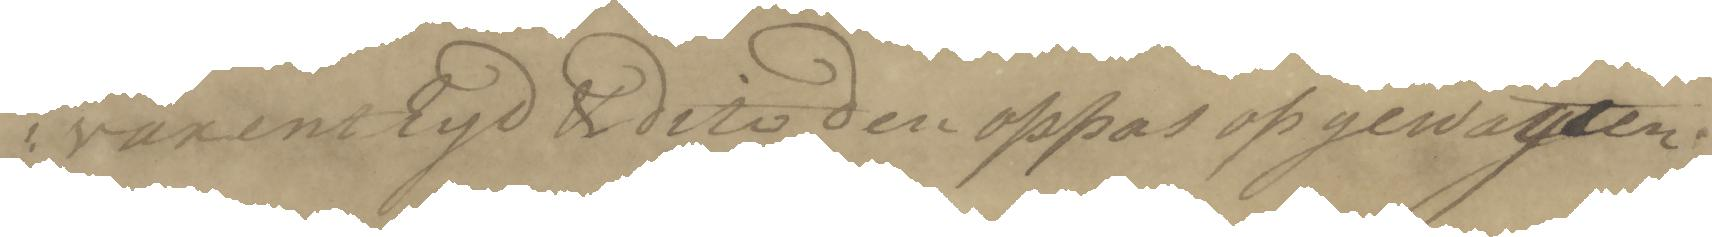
„varenthyd & dito den oppas op gewagten.
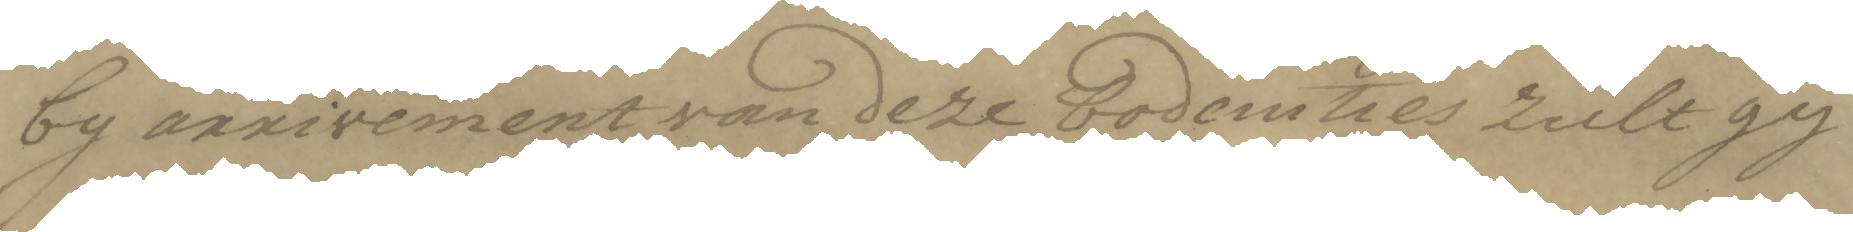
by arrivement van deze bodemties zult gij
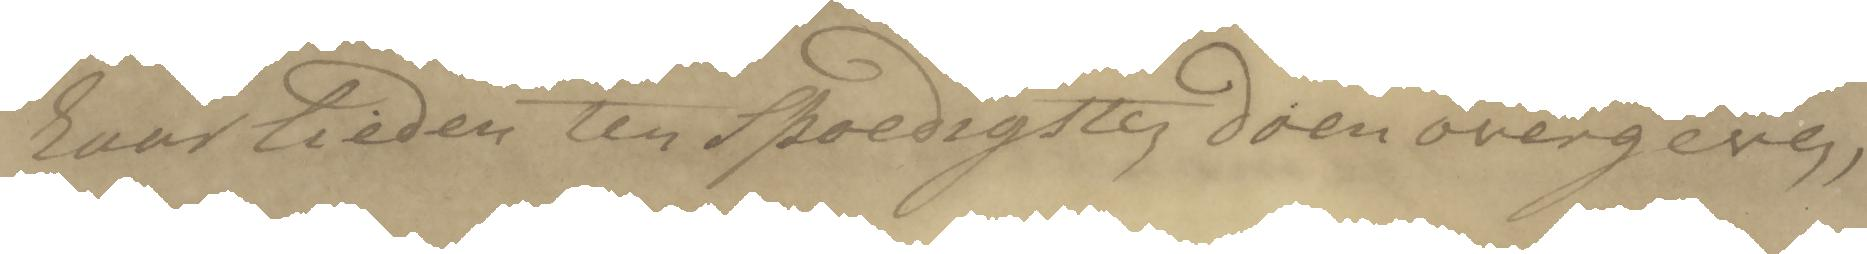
haar lieden ten spoedigsten doen overgeven,
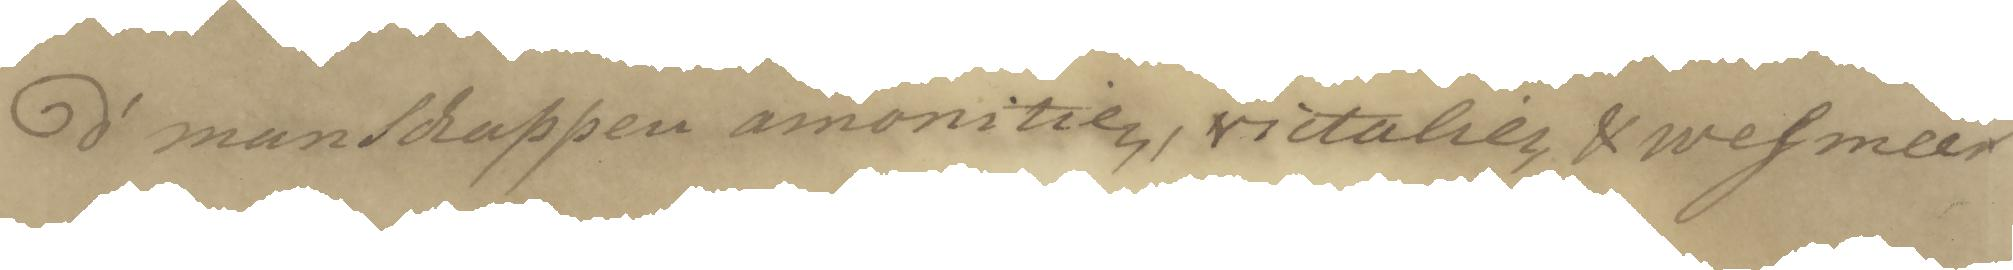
d’ manschappen amonitien, victalien & wes meer
